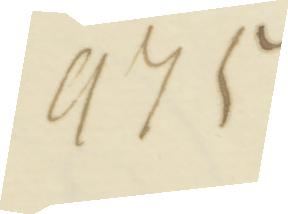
975
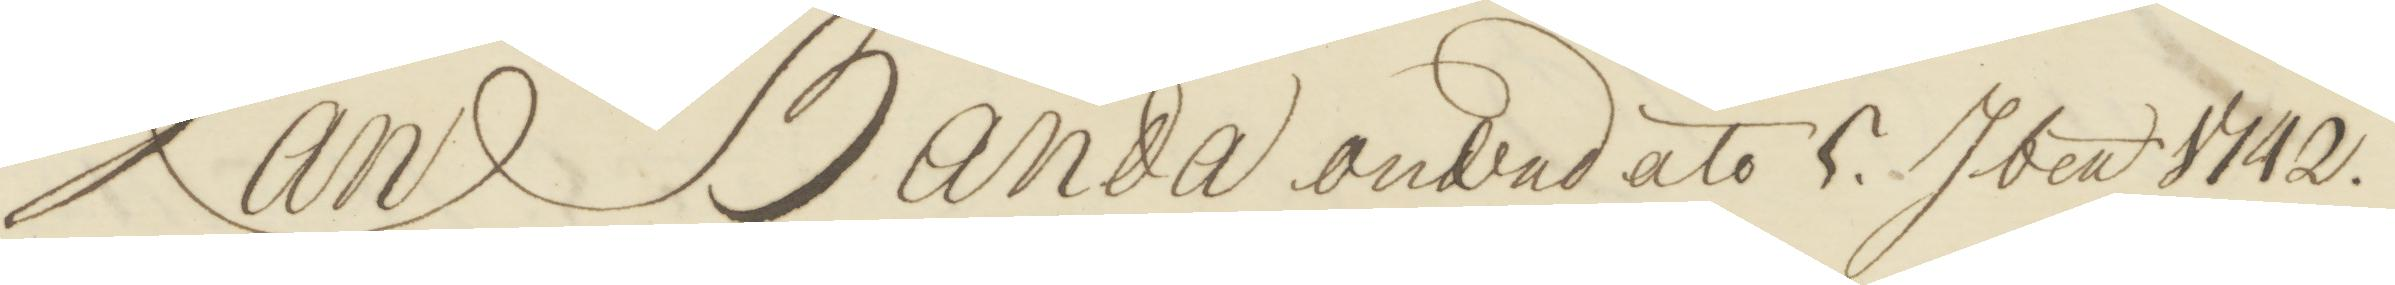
Van Banda onder dato 5. Jber: 1742.
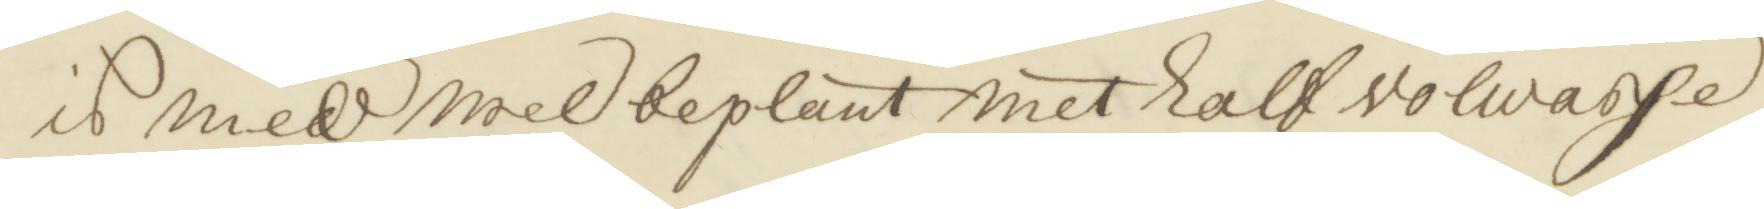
is mede wel beplant met half volwasse
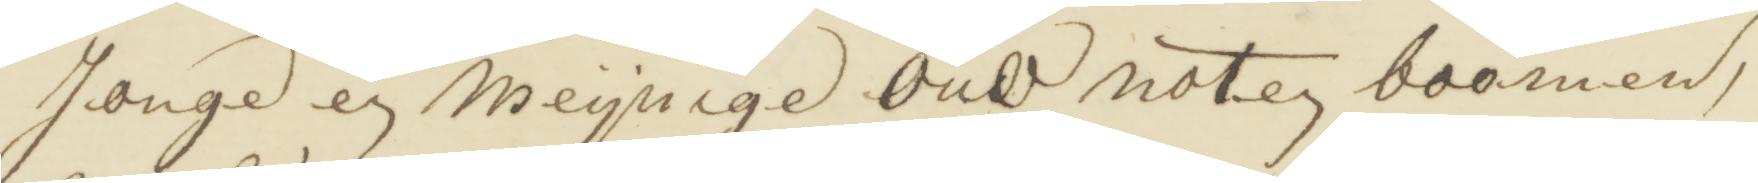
Jonge en weijnige oude noten boomen,
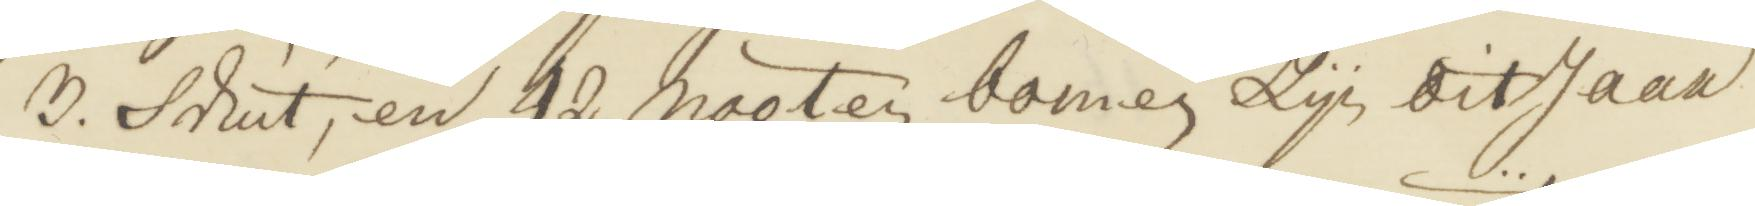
3. schut, en 42. nooten bomen zijn ditJaar
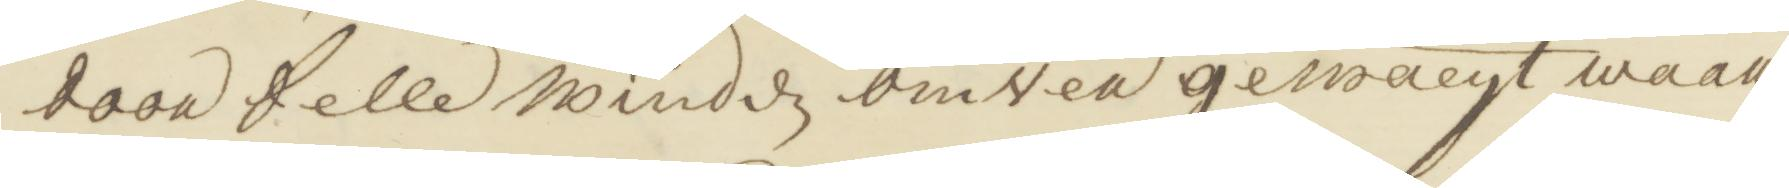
door felle winden omver gewaeijt waar
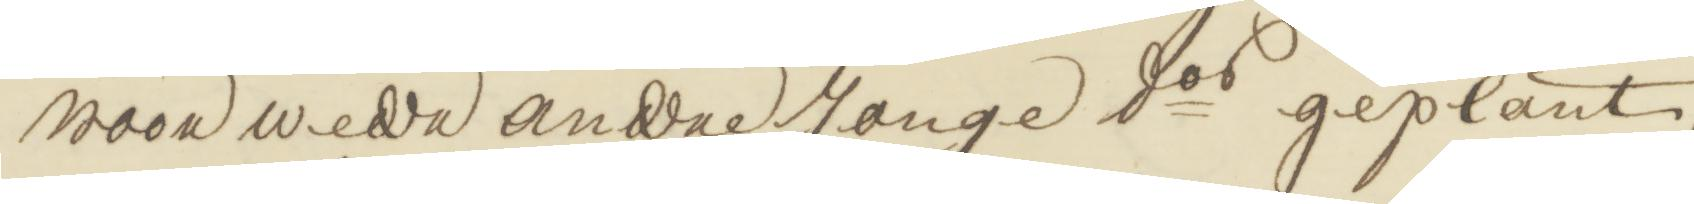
voor weder andere Jonge d=os geplant
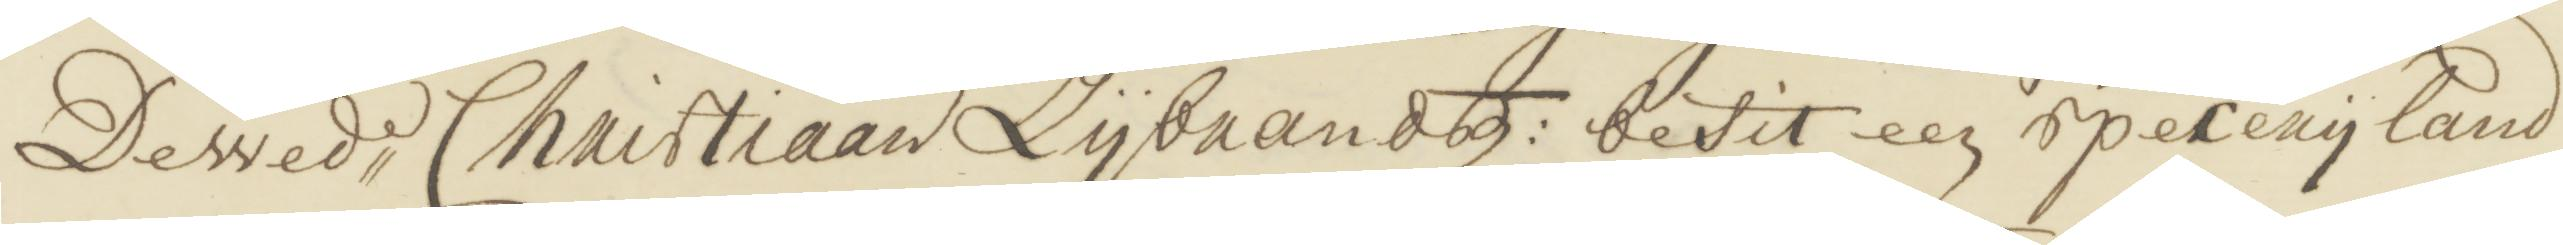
De wed„e Christiaan Zijbrandsz: besit een specerij land
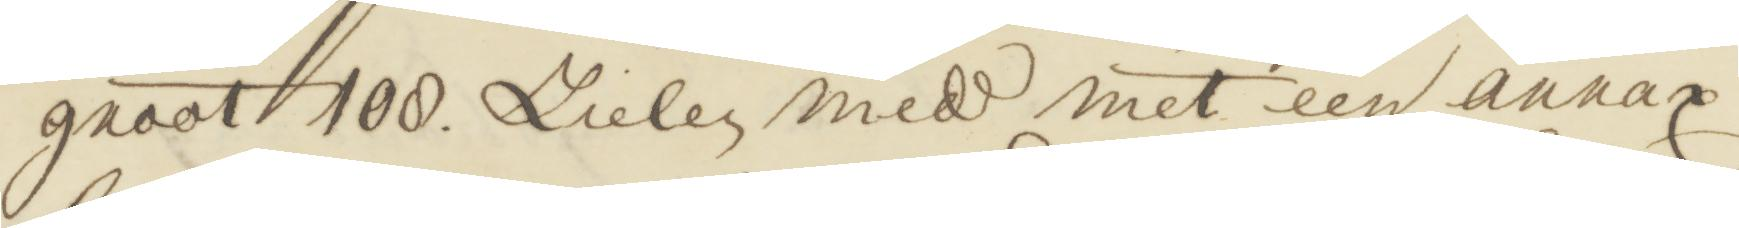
groot 108. Zielen mede met een arrax
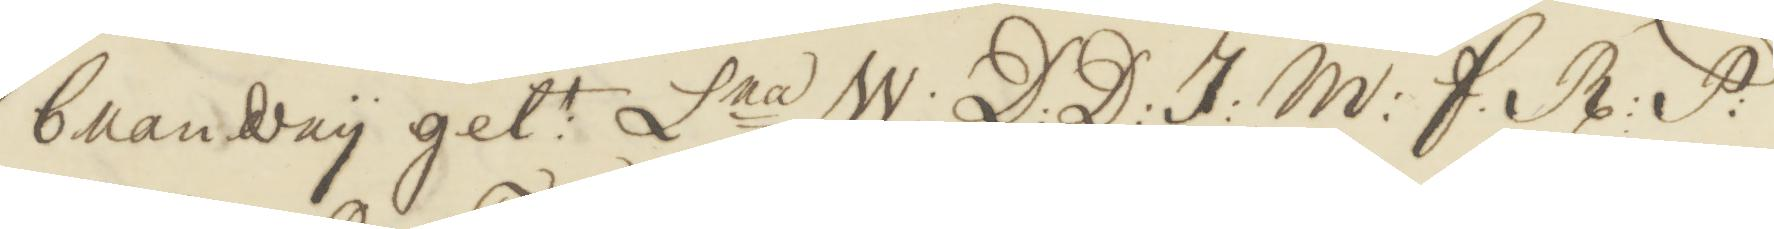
branderij gel:t L=ra W: D: D: I: M: f: R: P:
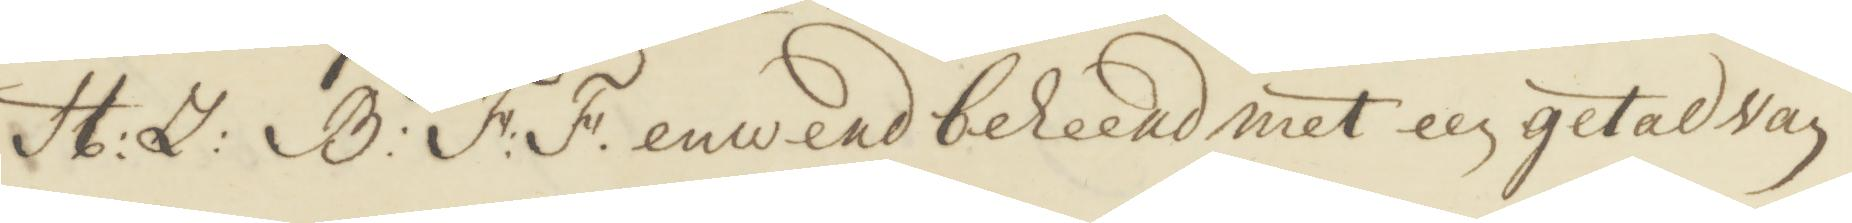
H: Z: B: F: F: enwerd beheerd met een getal van
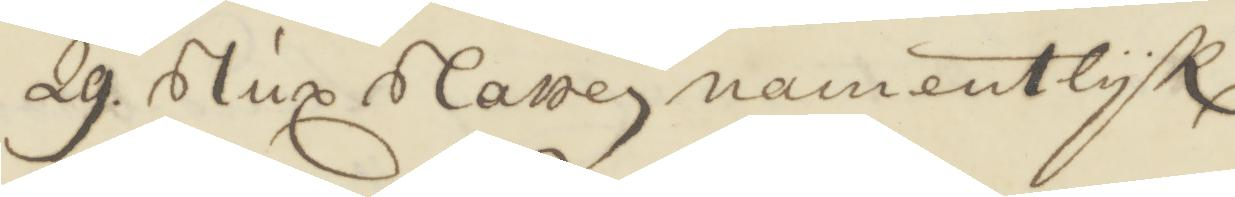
29. stux slaven namentlijk
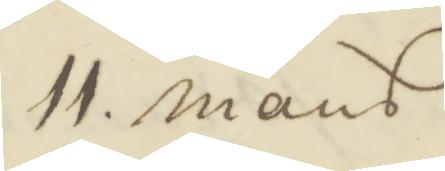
11. mans
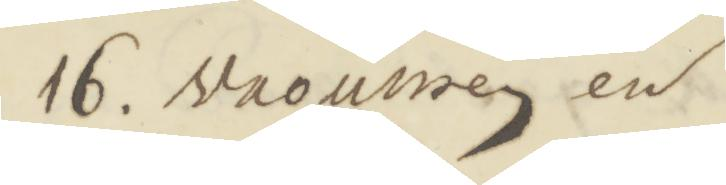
16. vrouwen en
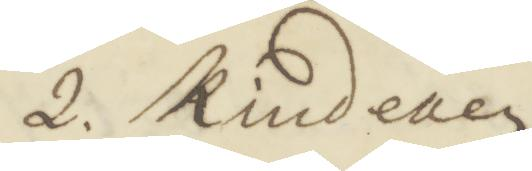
2. Kinderen
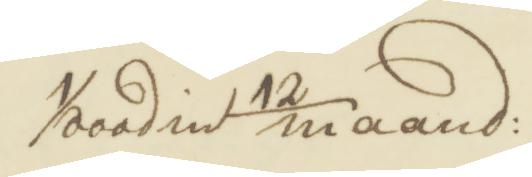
1/dood in 12/maand:
